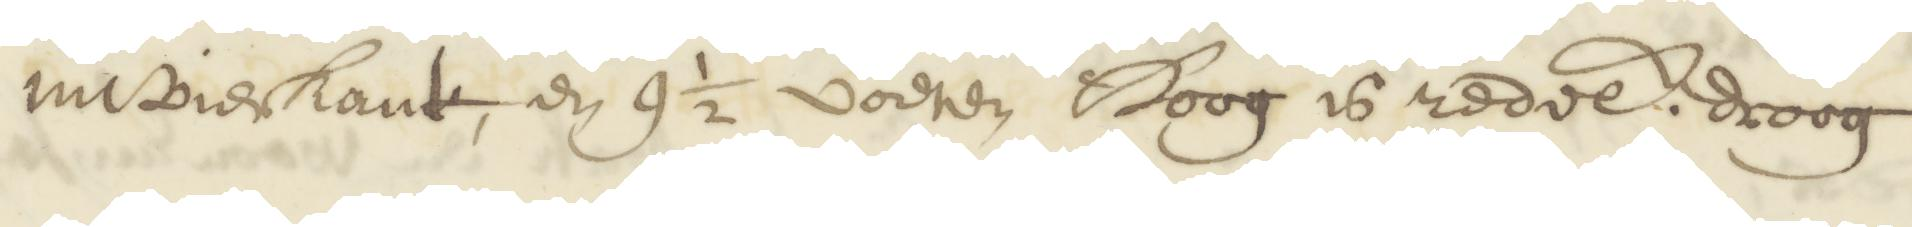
in'tvierkant, en 9½ voeten Hoog is redel. droog
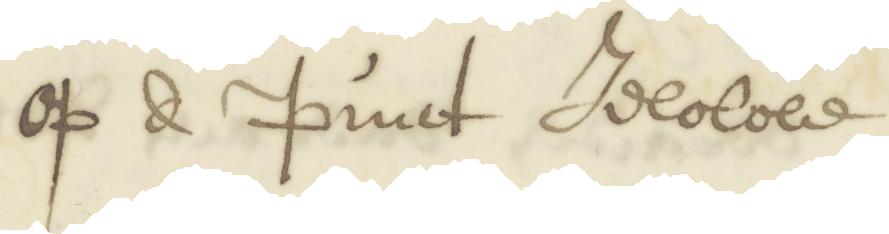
op d punt Ielolole
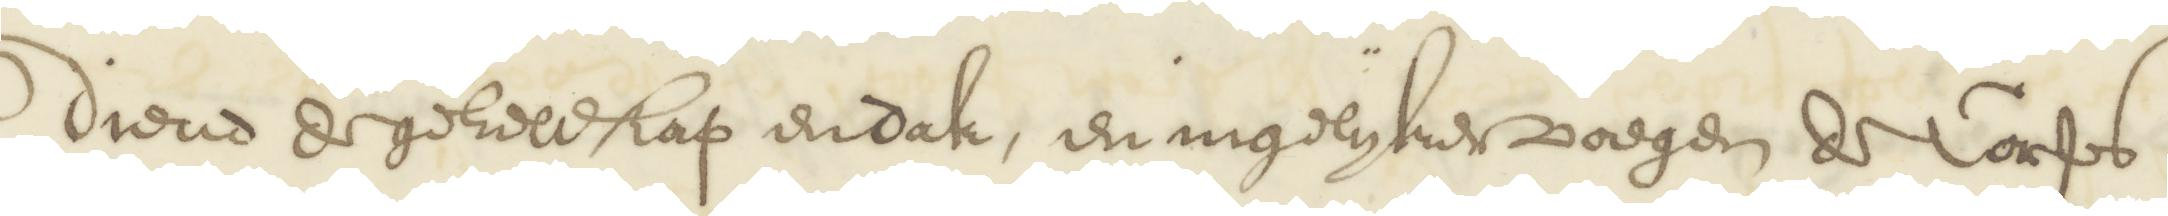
diend de gehelekap endak, en ingelijker voegen de Corps
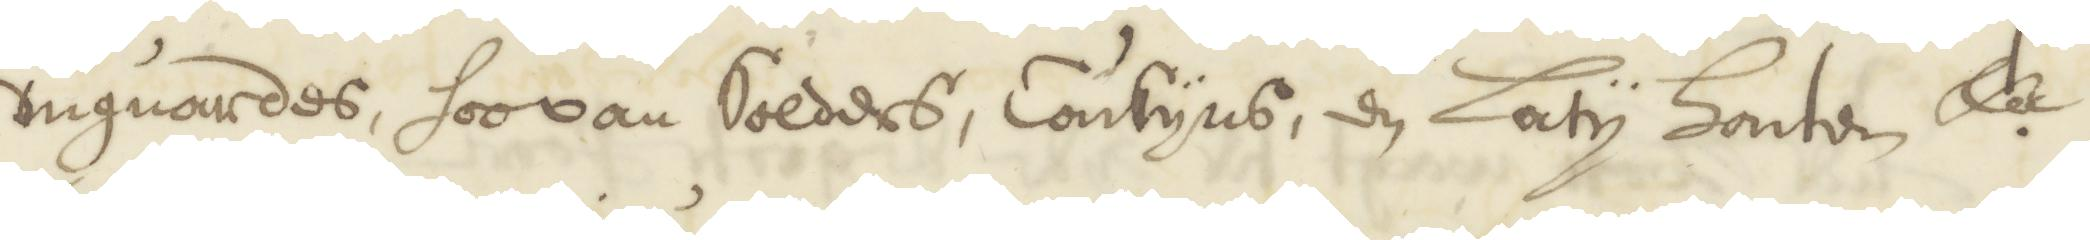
duguardes, soo van solders, Cousijns, en latij houten &.a
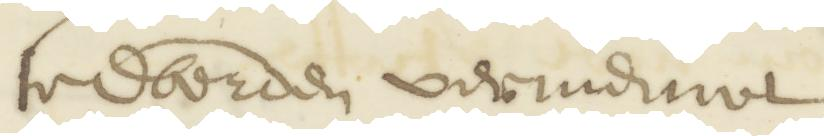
te werden vernieuwt
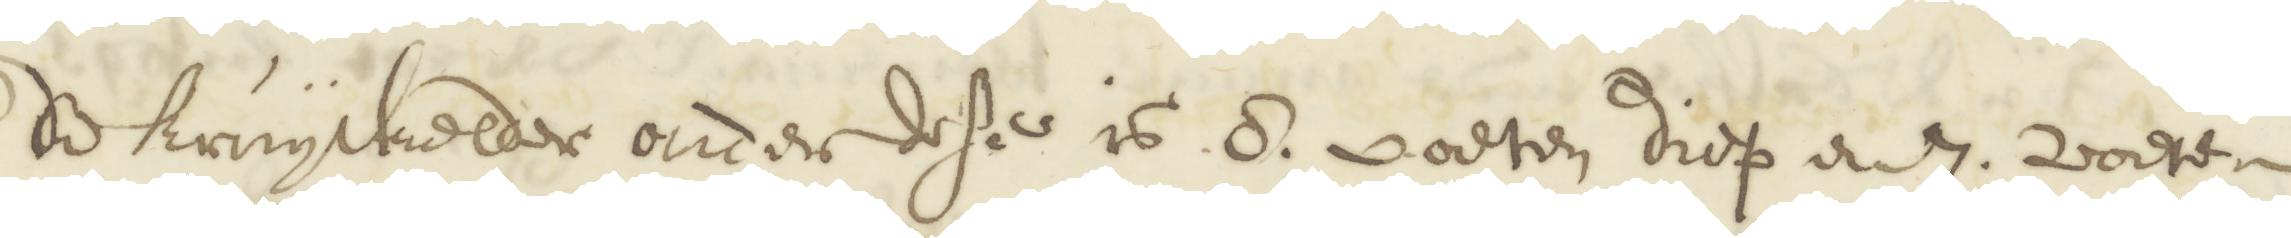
de kruijtkelder onder dese is 8. voeten diep en 7. voeten
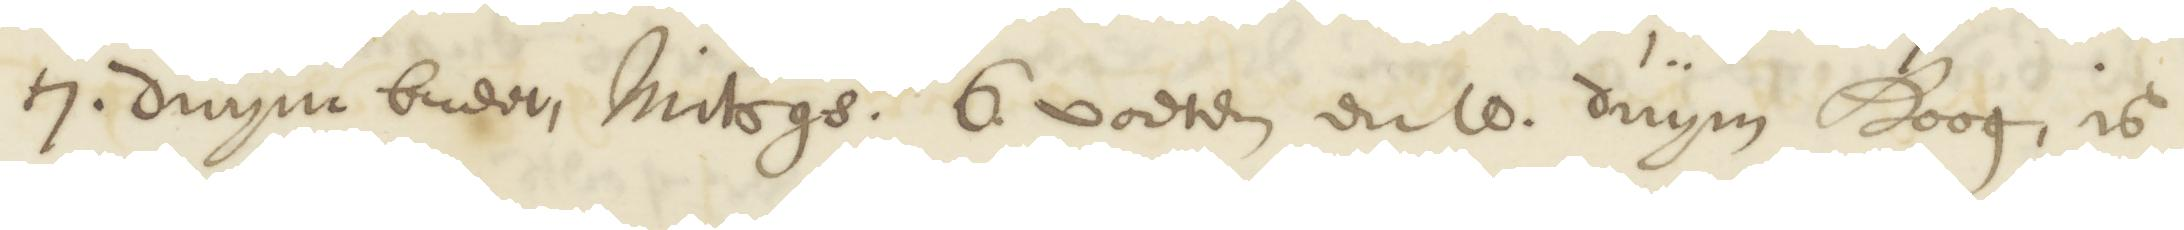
17. duijm breet, mitsgs. 6. voeten en 10. duijm Hoog, is
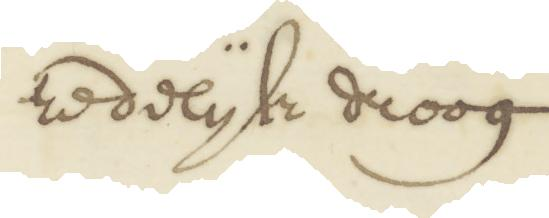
redelijk droog
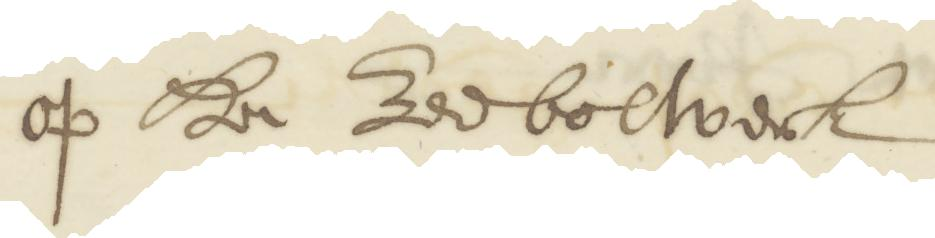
op het zeebolwerk
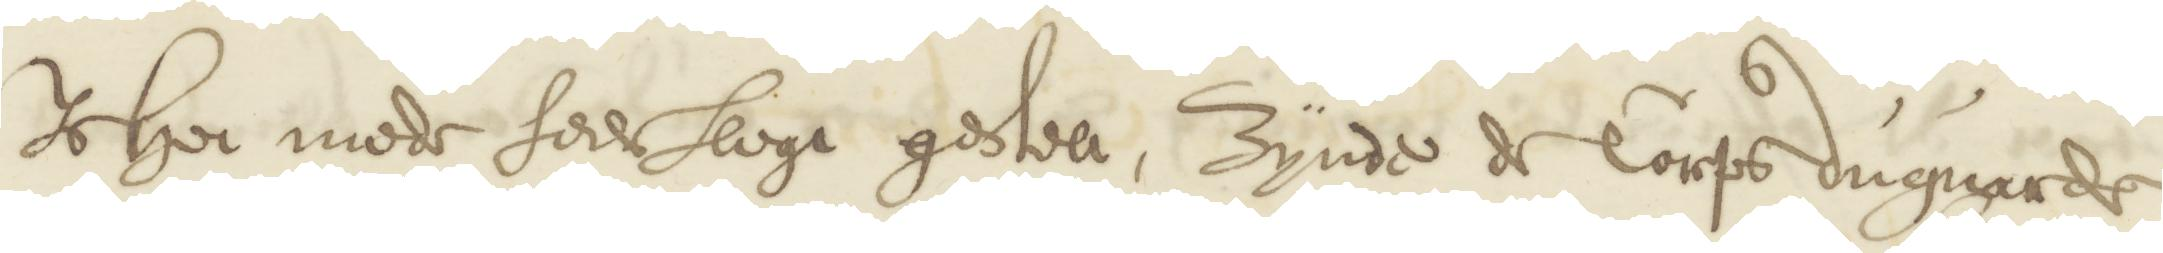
Is het mede seer slegt gestelt, zijnde de Corps duguarde
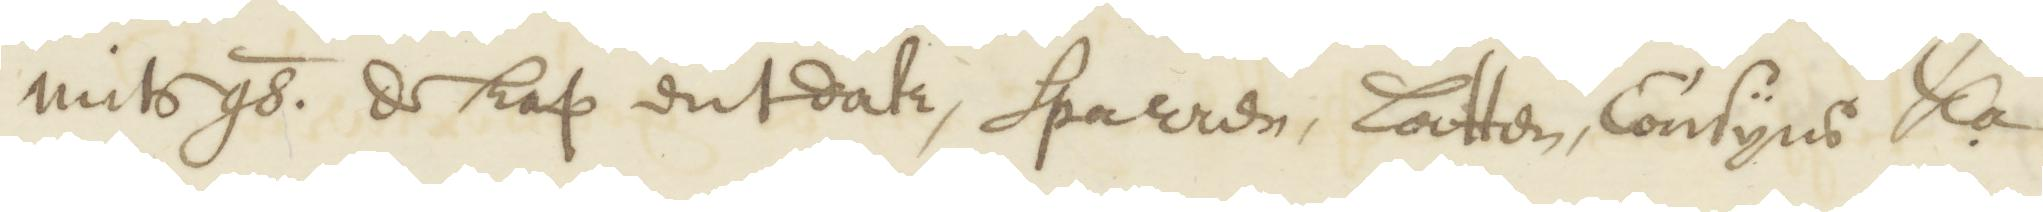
mitsgs. dekap entdak, sparren, latten, Cousijns &.a
